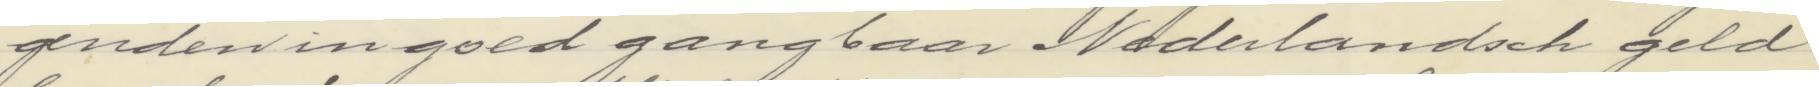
genden in goed gangbaar Nederlandsch geld
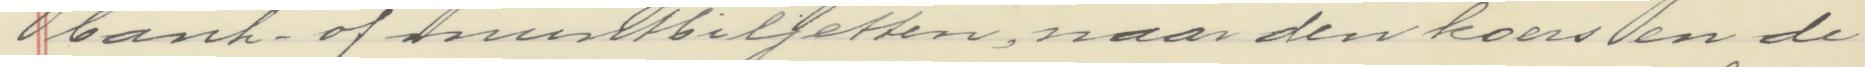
bank- of muntbiljetten, naar den koers en de
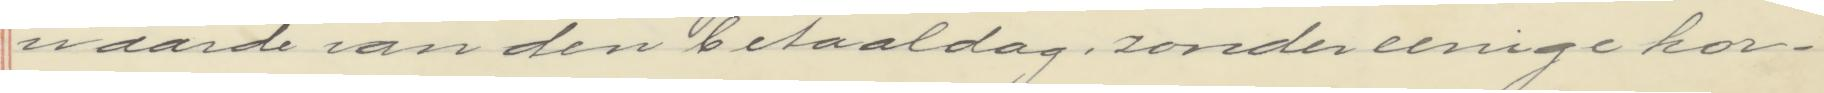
waarde van den betaaldag, zonder eenige kor-
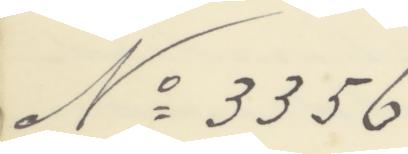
N=o 3356
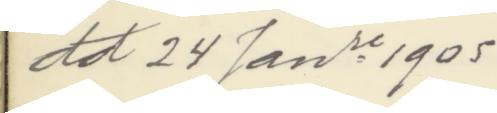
dd 27 Jan=ri 1905
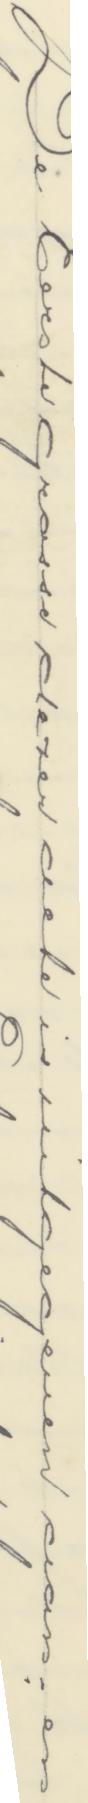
De Eerste grosse dezer acte is uitgegeven aan - en
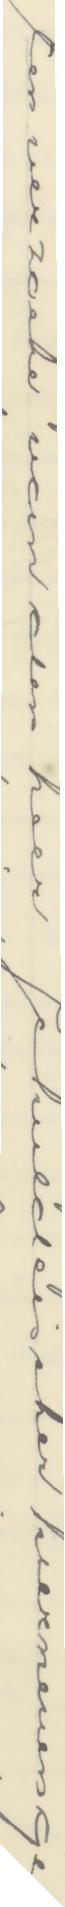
ten verzoeke van den heer schuldeischer hiernevens ge„
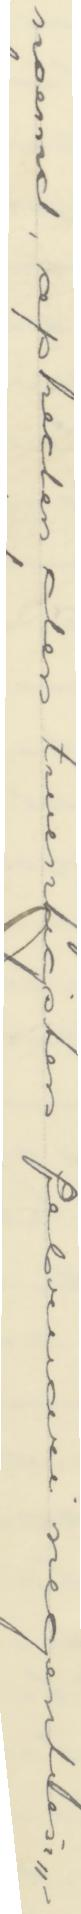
noemd, op heden den twintigsten februari negentien„-
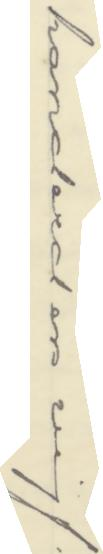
honderd en vijf
